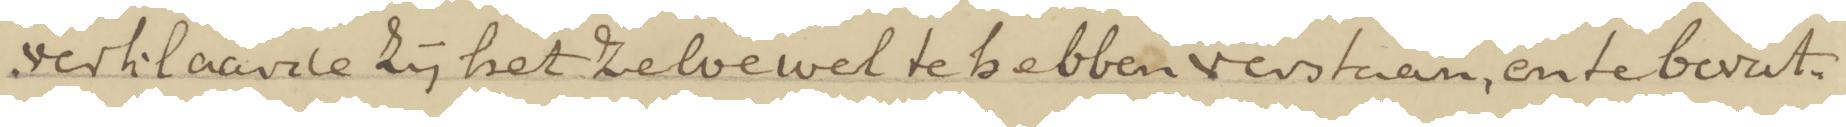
verklaarde zij het zelve wel te hebben verstaan, en te bevat=
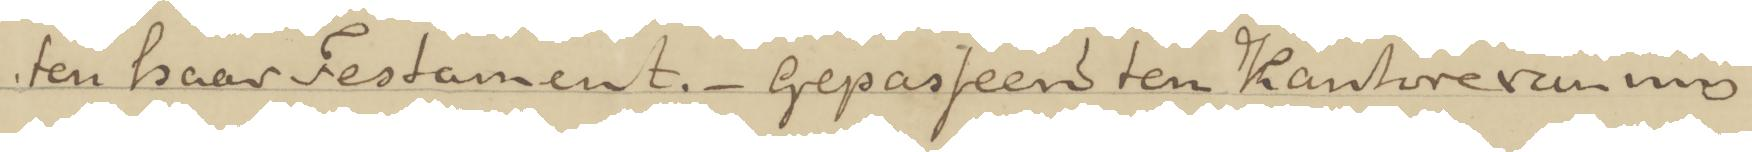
ten haar Testament Gepasseerd ten Kantore van mij
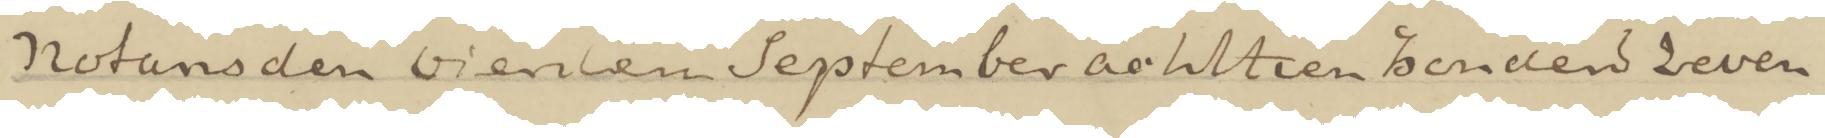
Notaris den vierden September achttien honderd zeven
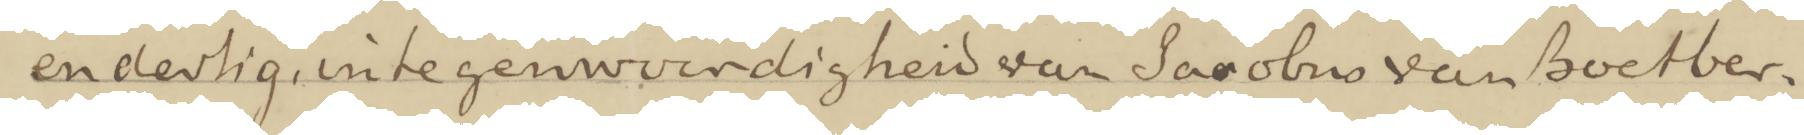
en dertig, in tegenwoordigheid van Jacobus van Boetber.
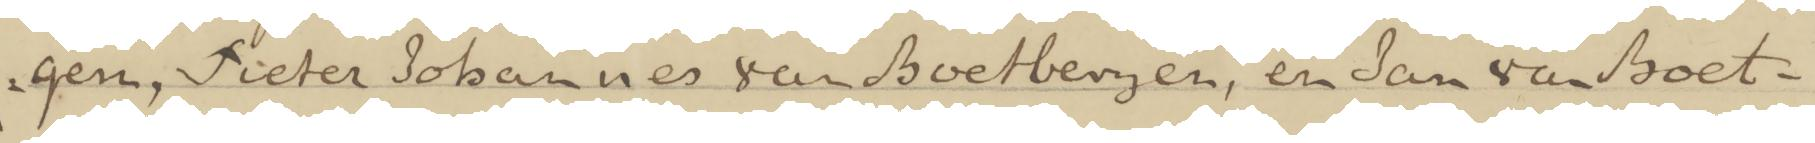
=gen, Pieter Johannes ven Boetbergen, en Jan van Boet-
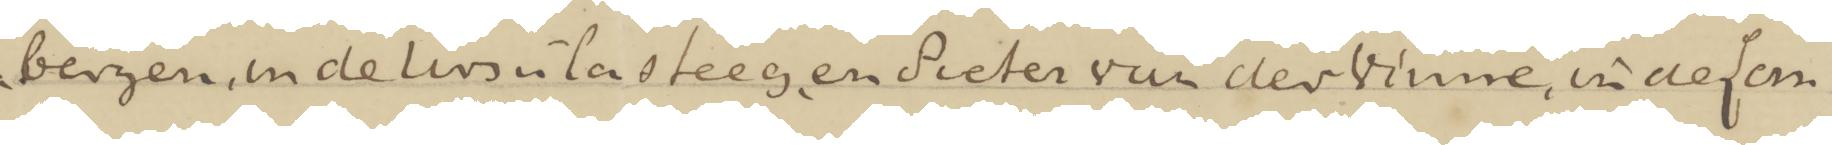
=bergen, in de ursulasteeg, en Pieter van der Vinne, in de Lom
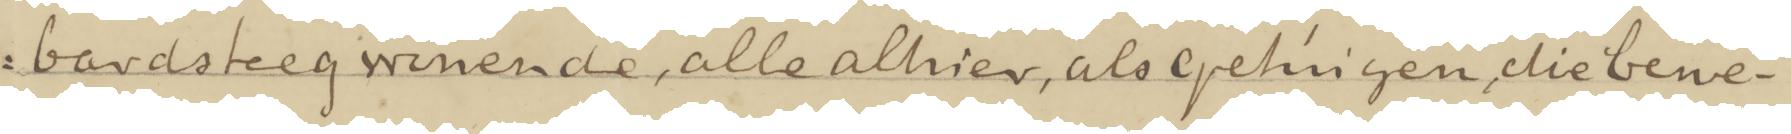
=bardsteeg wonende, alle alhier, als getuigen, die bene-
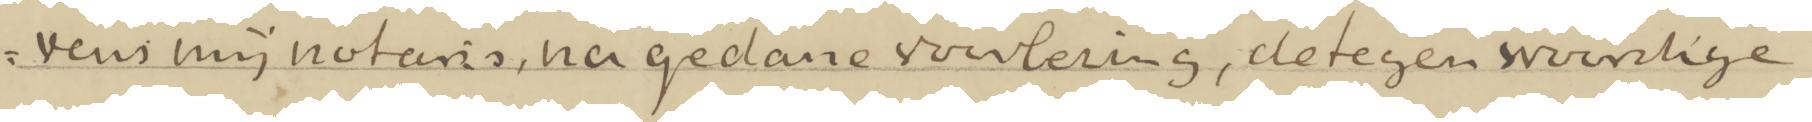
=vens mij notaris, na gedane voorlezing, de tegen woordige
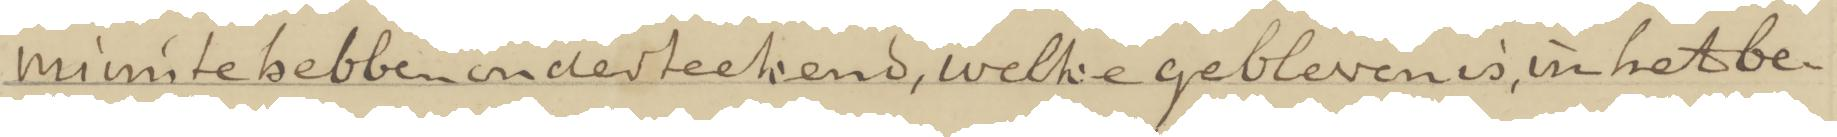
minute te hebben onderteekend, welke gebleven is, in het be-
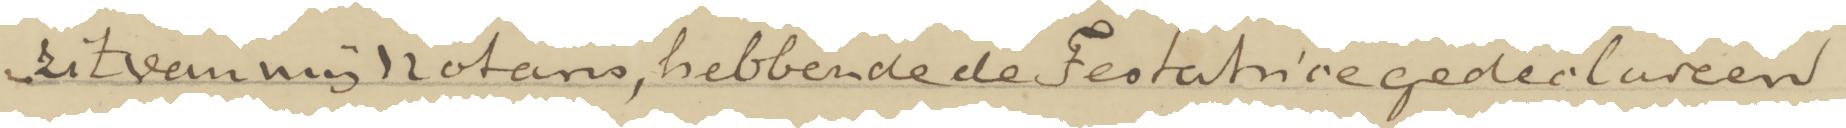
=zit van mij Notaris, hebbende de Testatrice gedeclareerd
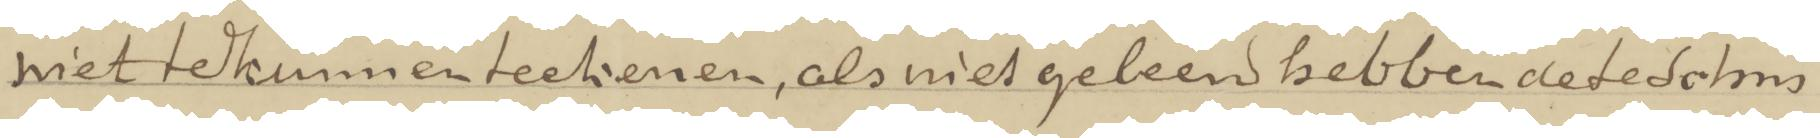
niet te kunnen teekenen, als niet geleerd hebbende te schrij
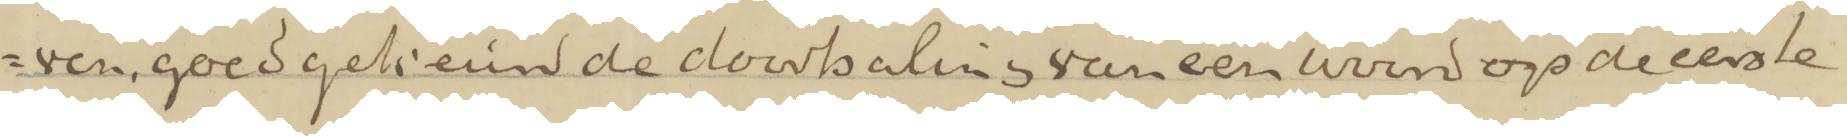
=ven, goed gekeurd de doorhaling van één woord op de eerste
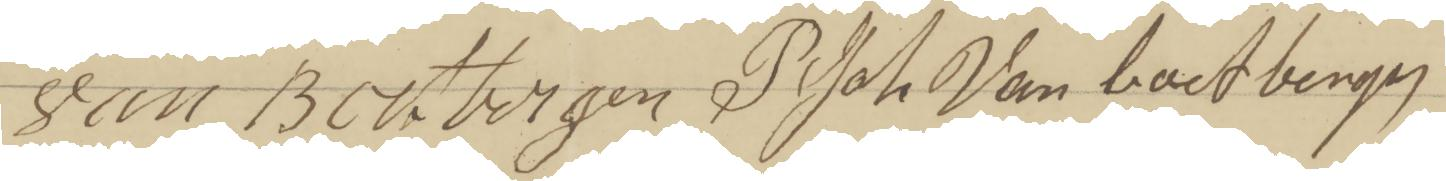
J van Boetbergen P Joh Van boetbergen
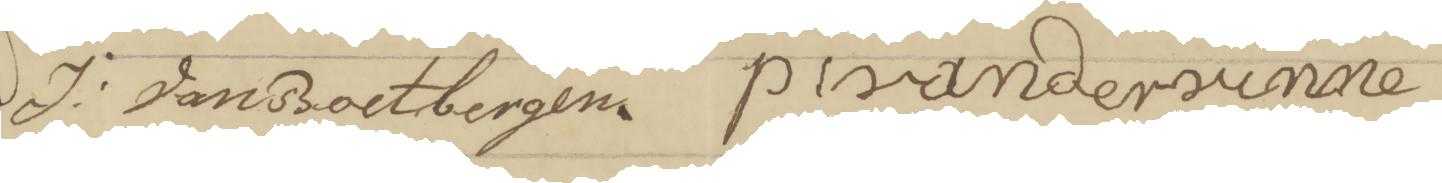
J: van Boetbergen, p: vandervinne
